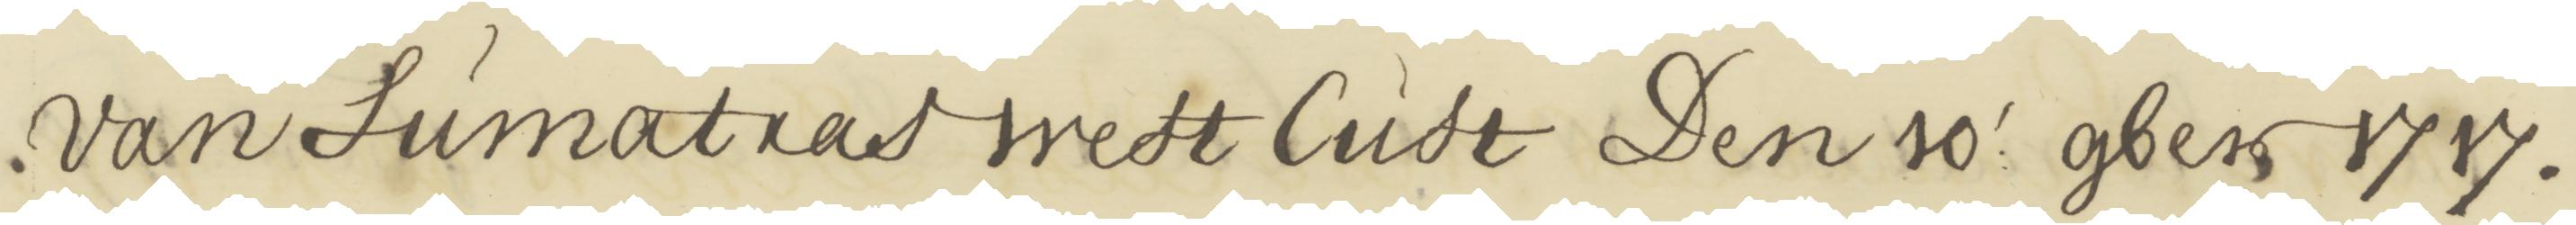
Van Sumatras west Cust Den 10.' 9ber, 1717.
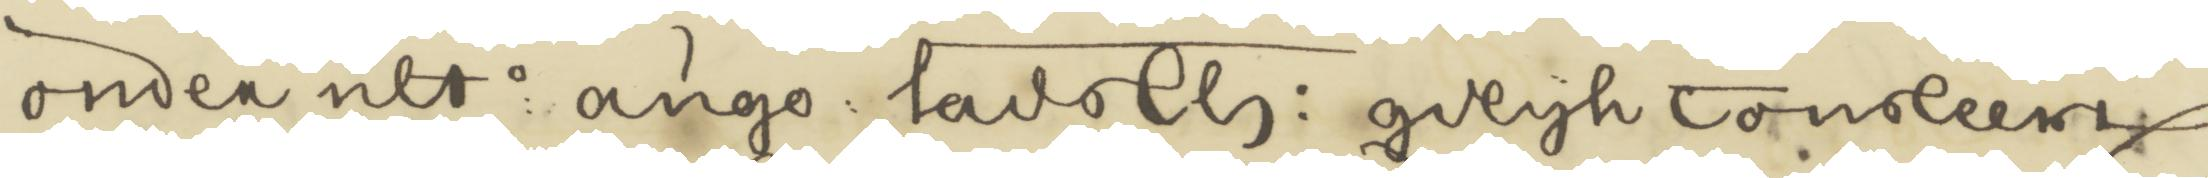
onder ult:o augo: laestl: gelijk consteert
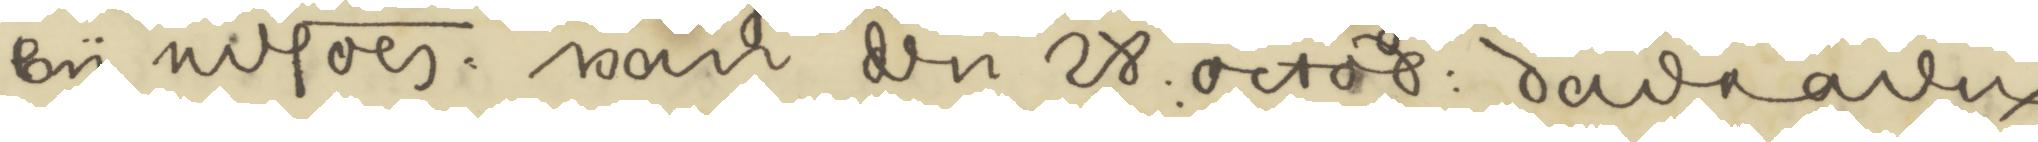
bij resol: van den 28. octob: daer aen
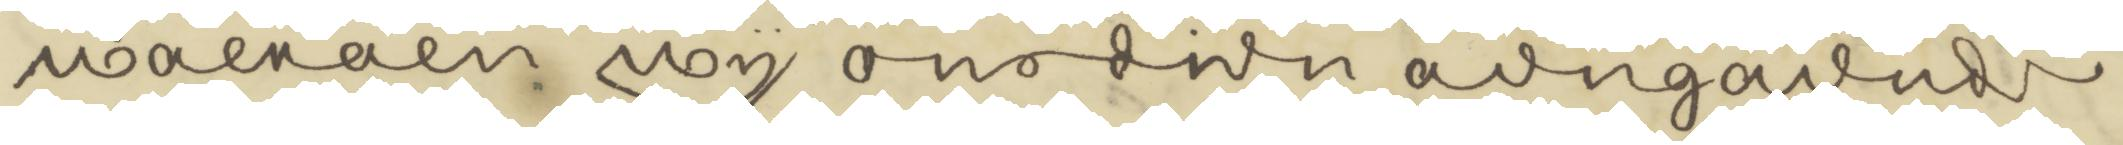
waeraen wij ons dien aengaende
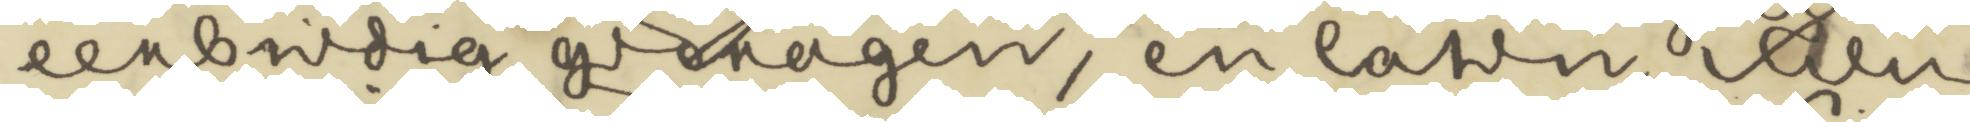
eerbiedig gedragen, en laten Een
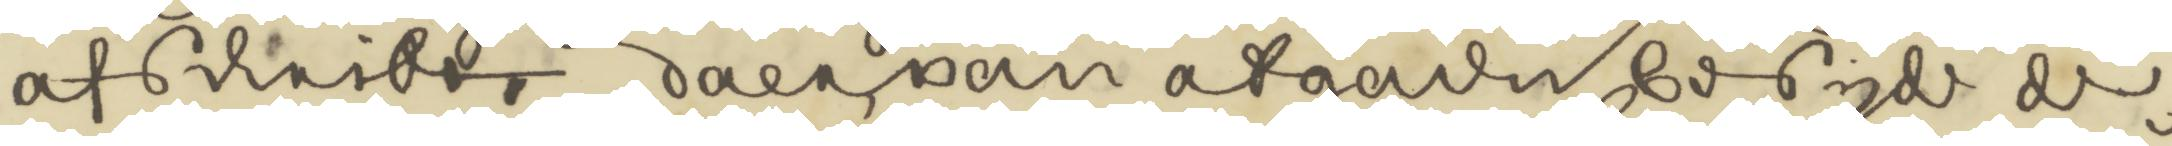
afschrivt daer van afgaen besijde de
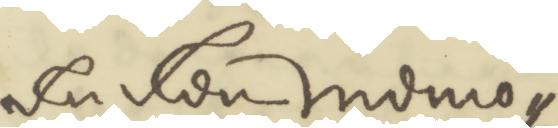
En Een memo„
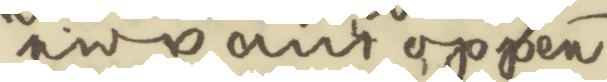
rie van't opper
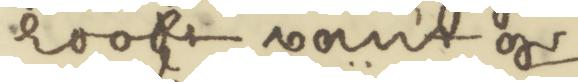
hooft van’t ge
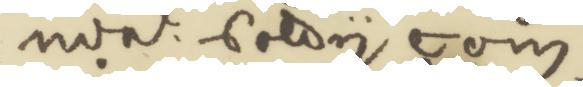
ner.l soldij com
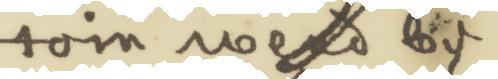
toir werd be
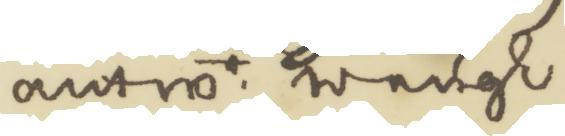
antw.t terugh
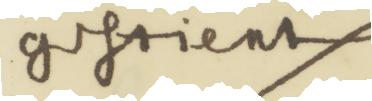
gestiert.
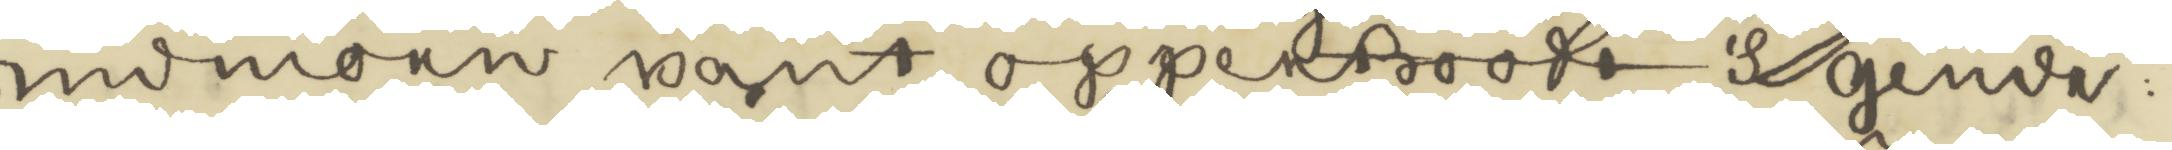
memorie van 't opperthooft ’s gener:e
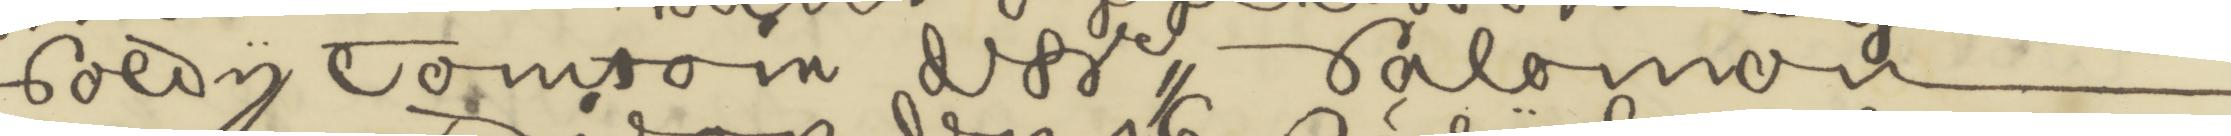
soldij comtoir dese„ salomon
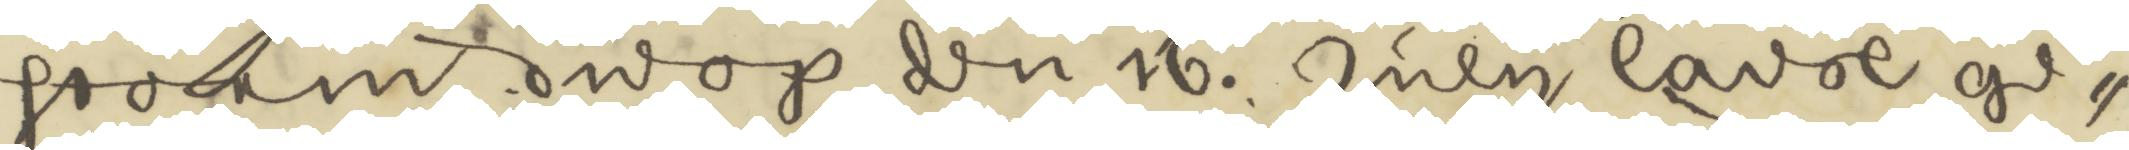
storm die op den 16. Julij laest ge„
